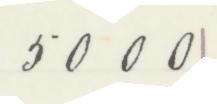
5000
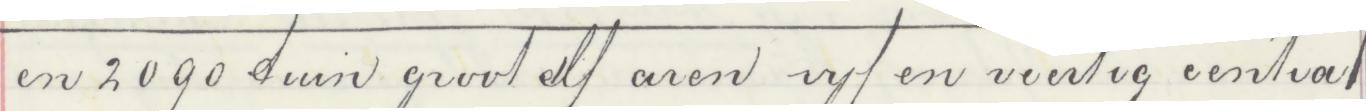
en 2090 tuin groot elf aren vyf en veertig centia
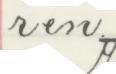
ren
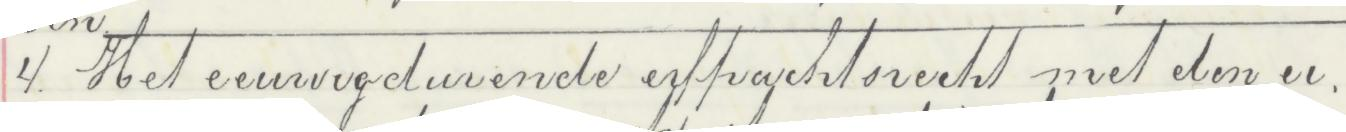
4. Het eeuwigdurende erfpachtsrecht met den ei
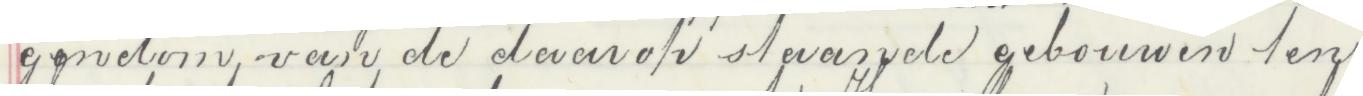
gendom van de daarop staande gebouwen ten
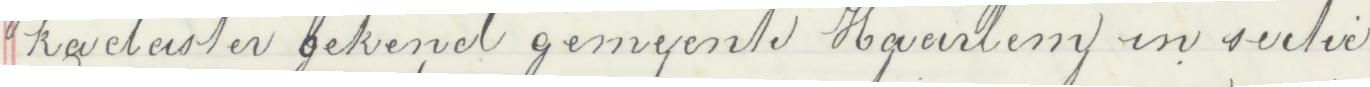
kadaster bekend gemeente Haarlem in sectie
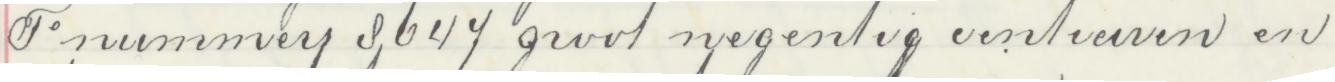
F nummer 8647 groot negentig centiaren en
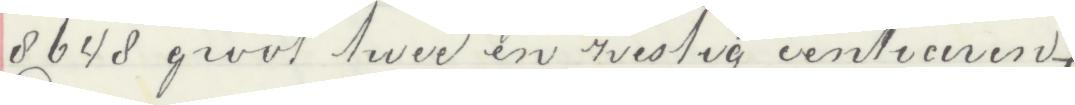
8678 groot twee en zestig centiaren
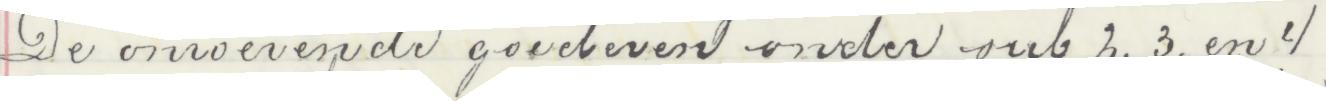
De onroevende goederen onder sub 2. 3. en 4
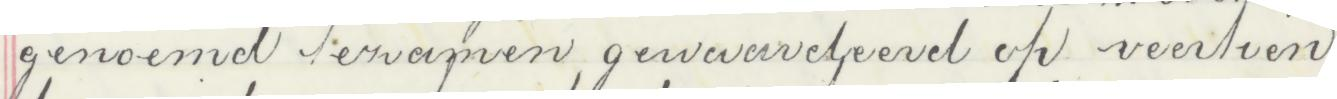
genoemd tezamen gewaardheerd op veertien
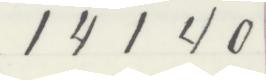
14140
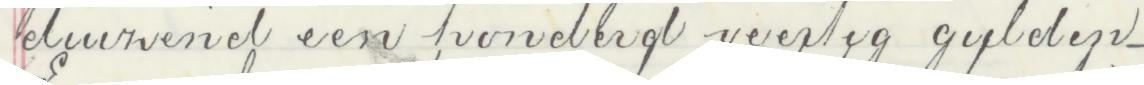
duizend een honderd veertig gulden
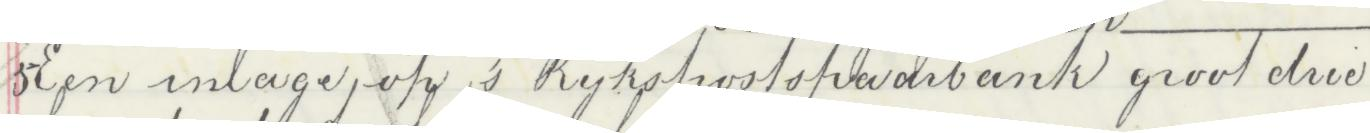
5 Een inlage, op 's Rykspostspaarbank groot drie
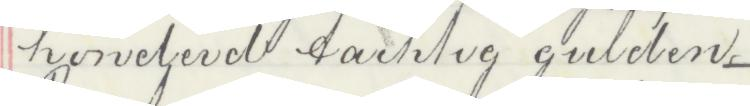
honderd tachtig gulden
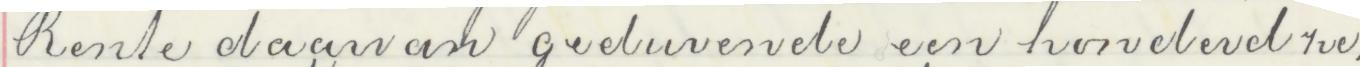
Rente daarvan gedurende een honderd ze
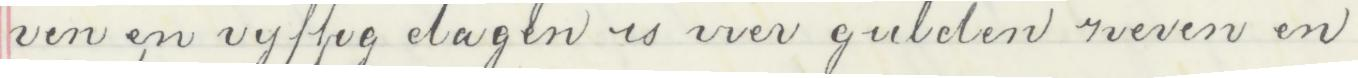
ven en vyftig dagen is vier gulden zeven en
